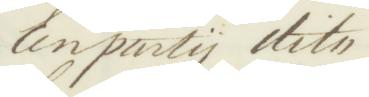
Eenpartij dito
